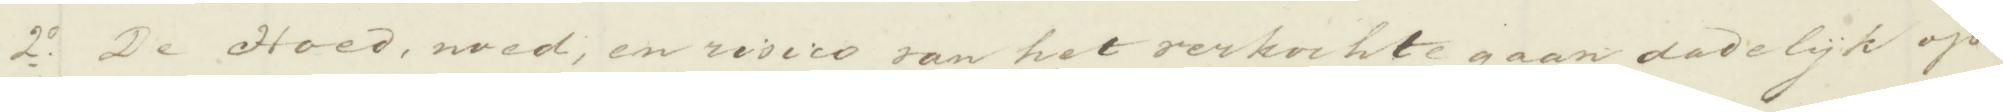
2.o De Hoed, noed, en risico van het verkochte gaan dadelijk op
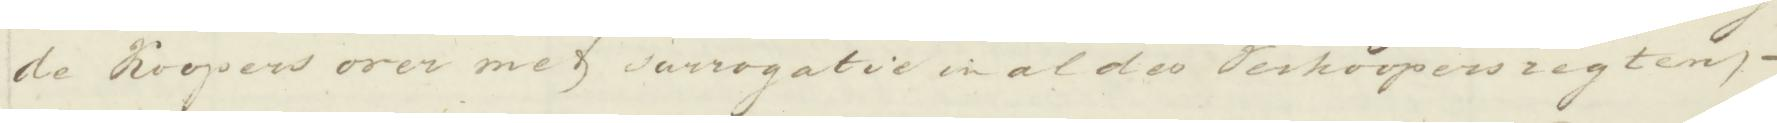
de Koopers over met surrogatie in al des Verkoopers regten
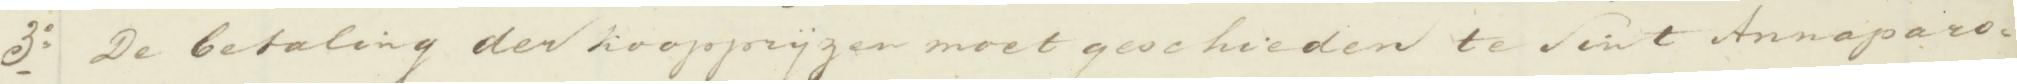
3=o De betaling der koopprijzen moet geschieden te Sint Annaparo
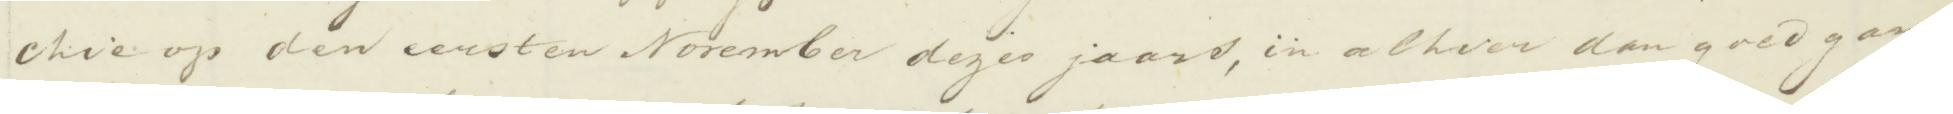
chie op den eersten November dezes jaars, in alhier dan goedgang
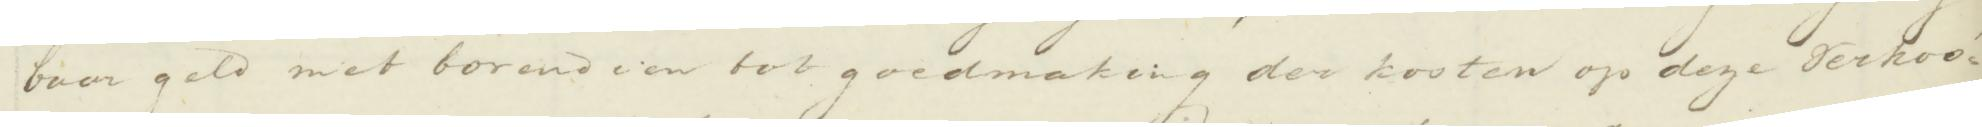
baar geld met bovendien tot goedmaking der kosten op deze Verkoo
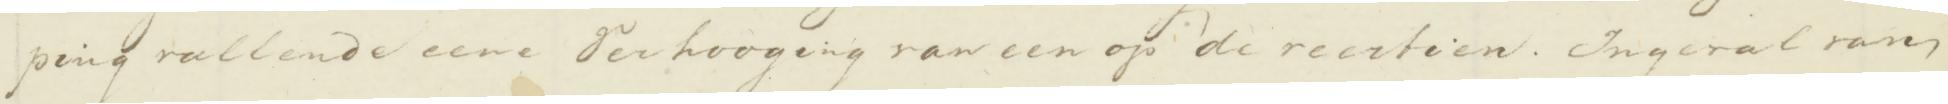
ping vallende eene Verhooging van een op de veertien. Ingeval van
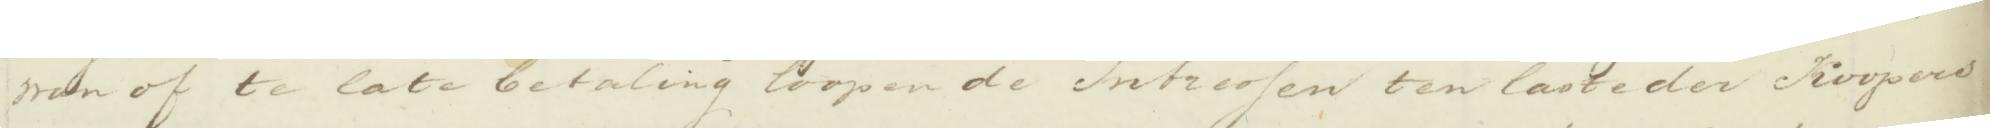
wan of te late betaling loopen de Intressen ten laste der Koopers
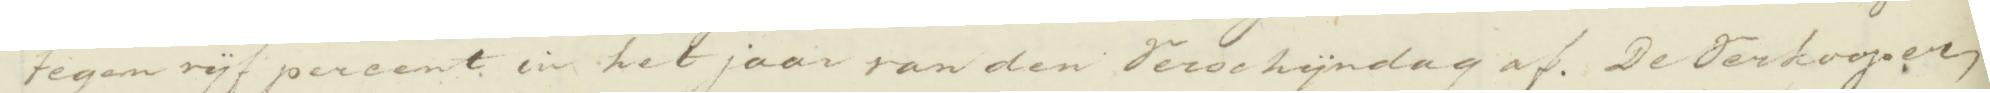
tegen vijf percent in het jaar van den Verschijndag af. De Verkooper
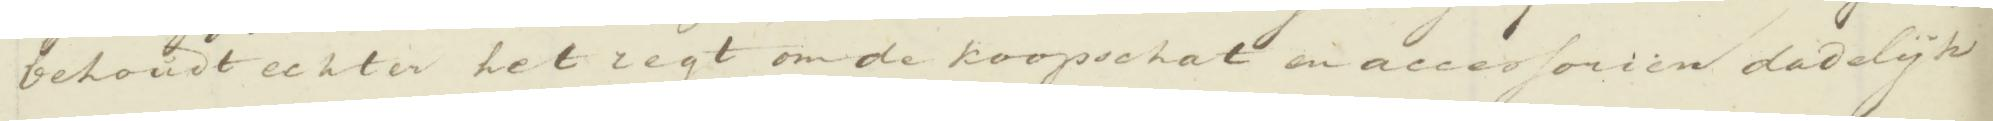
behoudt echter het regt om de koopschat en accessorien dadelijk
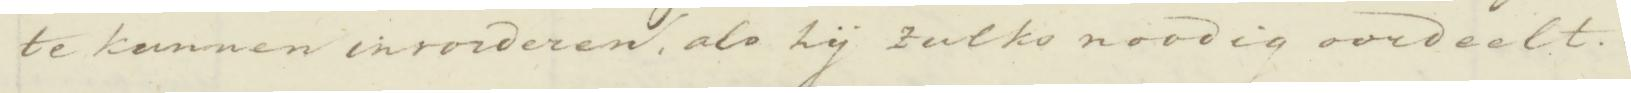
te kunnen invorderen, als zij zulks noodig oordeelt.
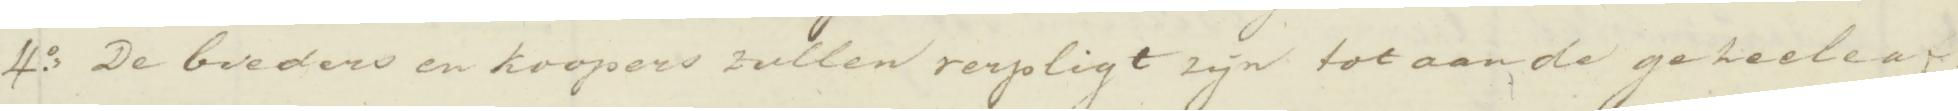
4.=o De bieders en koopers zullen verpligt zijn tot aan de geheele af
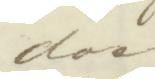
dor
